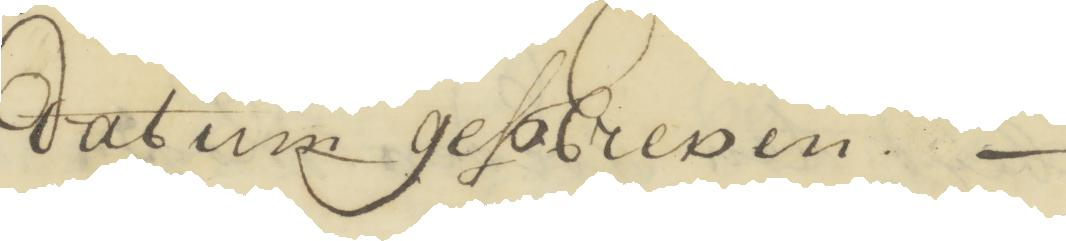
datum geschreven. —
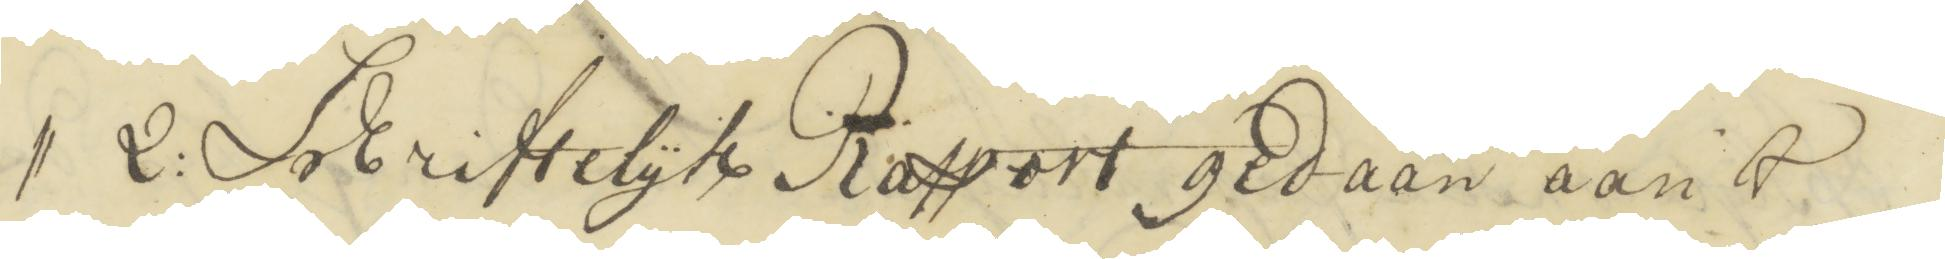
„ 2: Schriftelijk Rapport gedaan aan 't
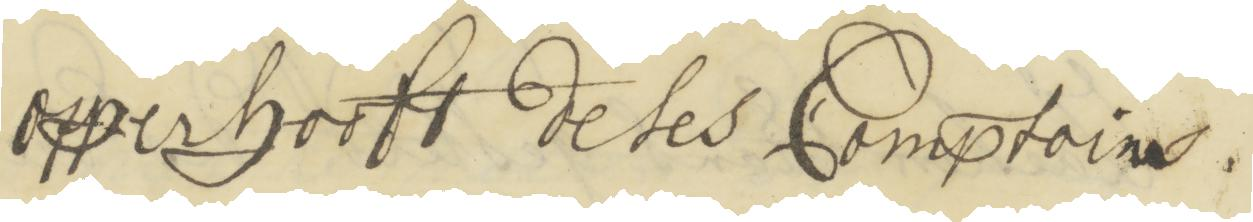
opperhooft deses Comptoirs.
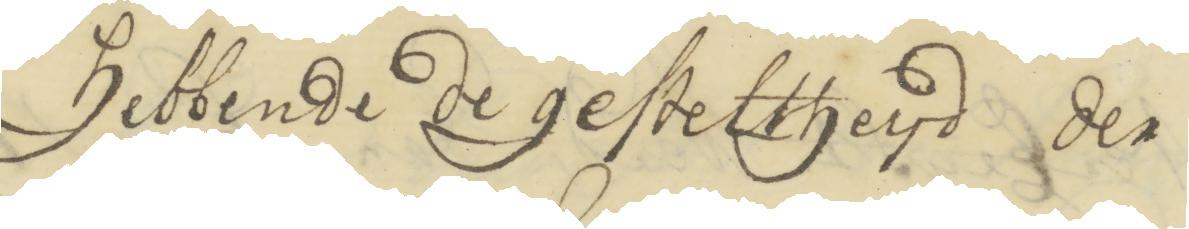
hebbende de gesteltheijd der
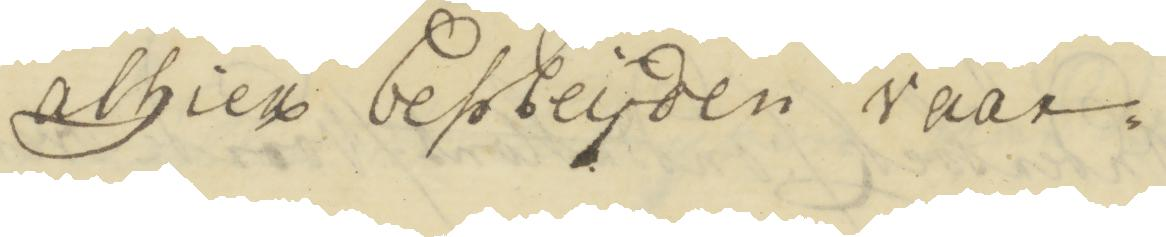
alhier bescheijden vaar„
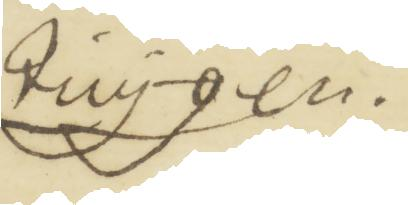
tuijgen.
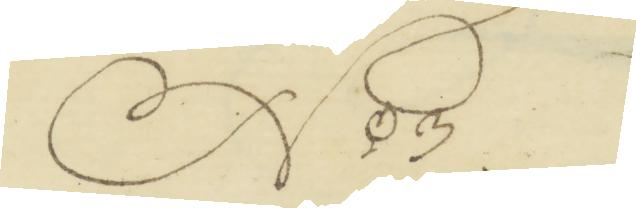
N:o 3.
